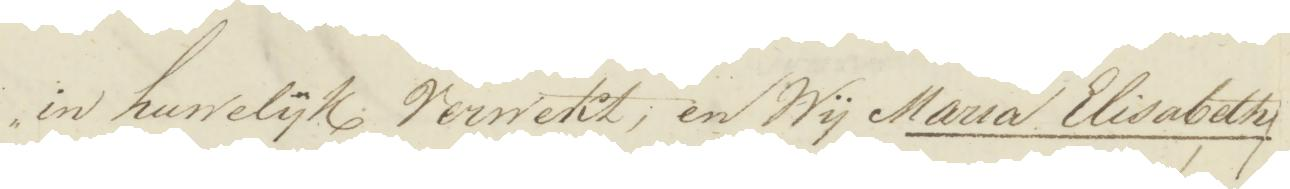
„in huwelijk Verwekt; en Wij Maria Elisabeth/
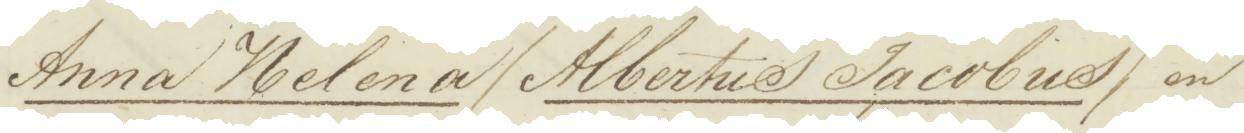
Anna Helena / Albertus Jacobus / en
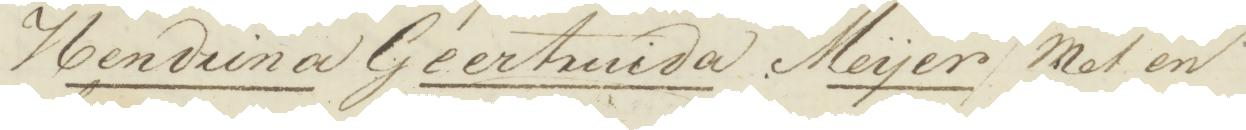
Hendrina Geertruida Meijer / met en
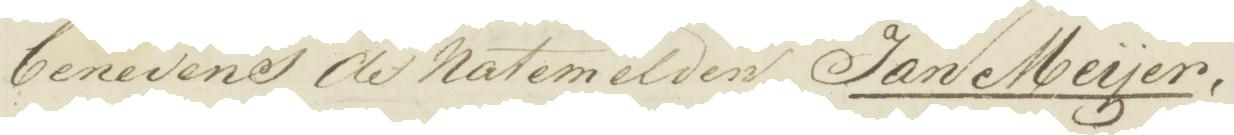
benevens de natemelden Jan Meijer,
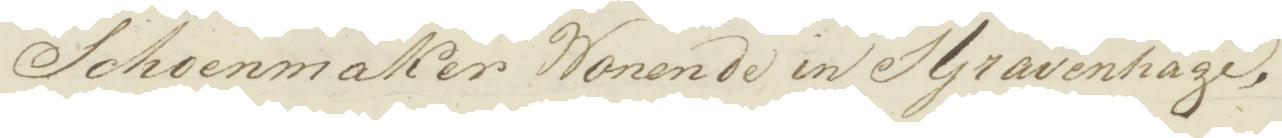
Schoenmaker Wonende in S Gravenhage,
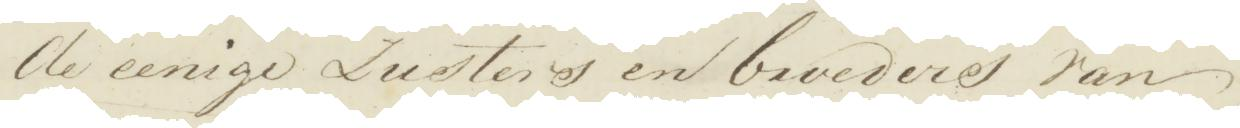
de eenige zusters en broeders van
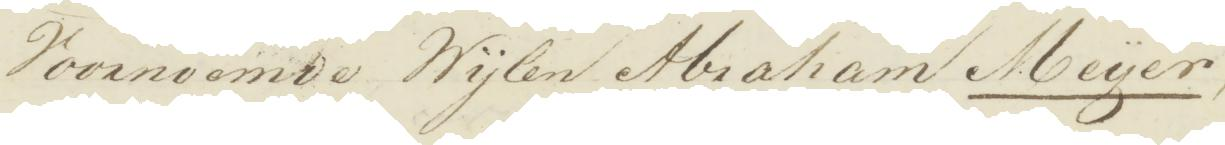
Voornoemde Wijlen Abraham Meijer,
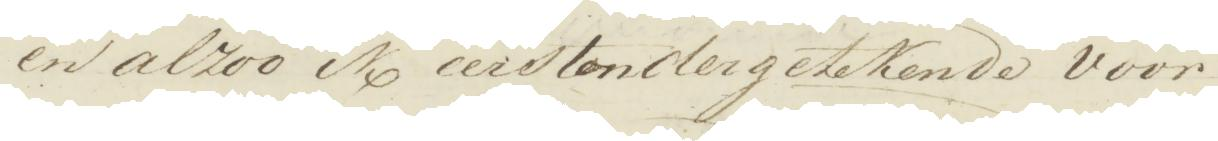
en alzoo ik eerstondergetekende voor
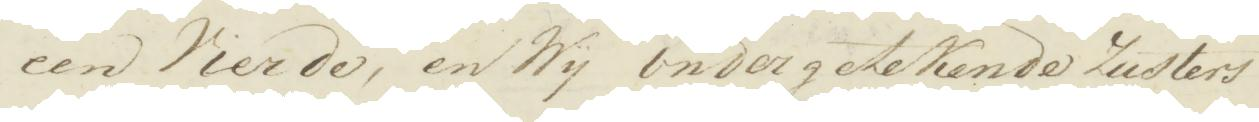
een Vierde, en Wij ondergetekende zusters
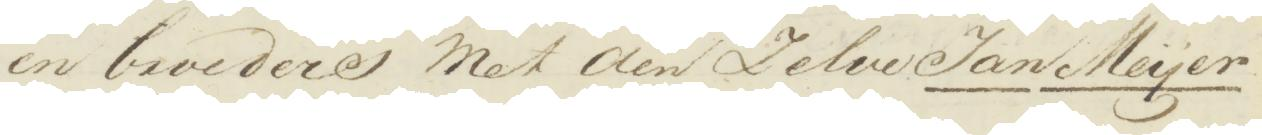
en broeders met den zelve Jan Meijer
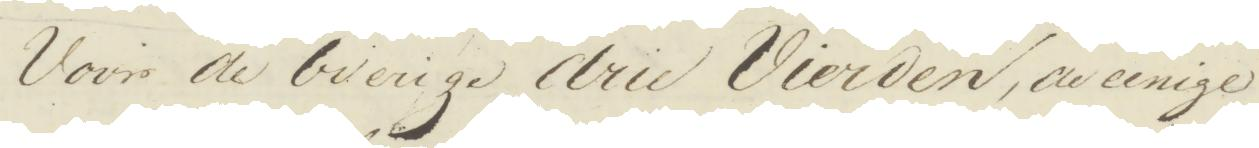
Voor de Overige drie Vierden, de eenige
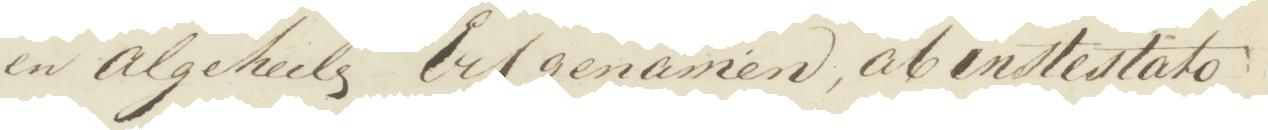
en algeheelen Erfgenamen, ab instestato
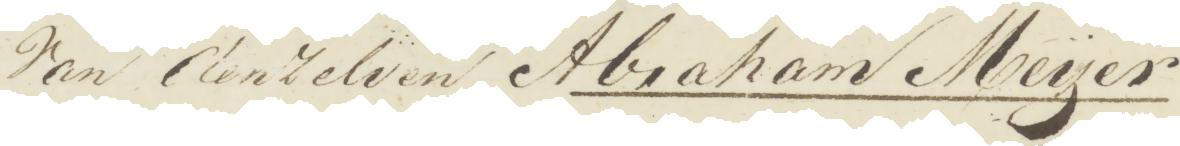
van denzelven Abraham Meijer
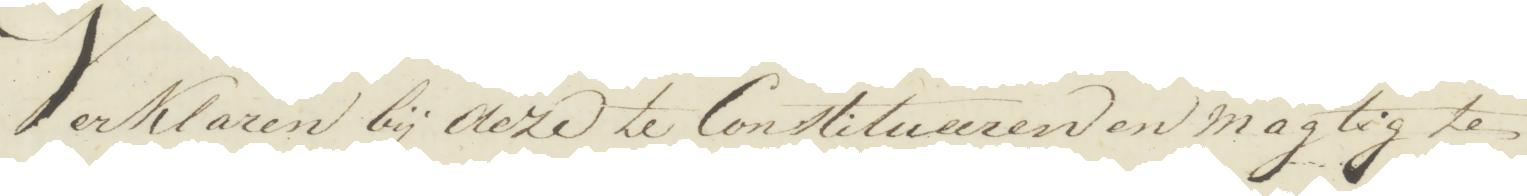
Verklaren bij deze te Constitueeren en magtig te
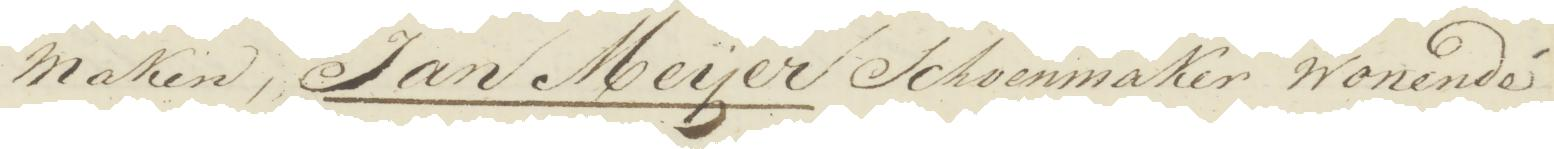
maken, Jan Meijer Schoenmaker, wonende
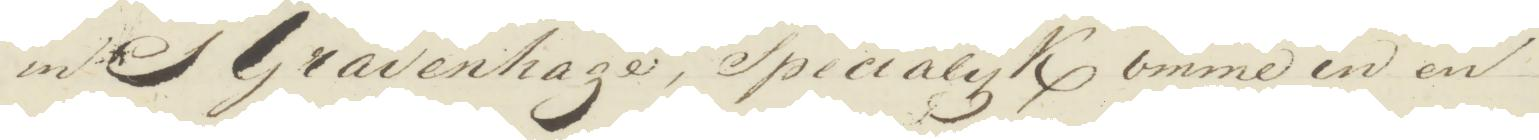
in S Gravenhage, specialijk omme in en
